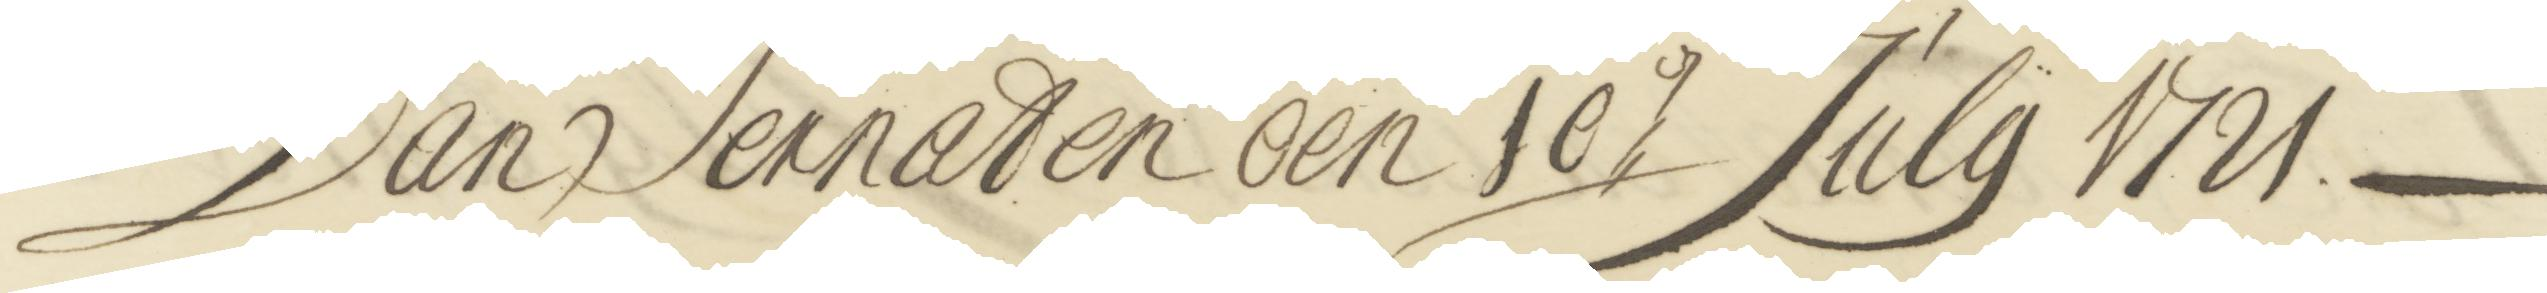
Van Ternaten den 10„e Julij 1721.—
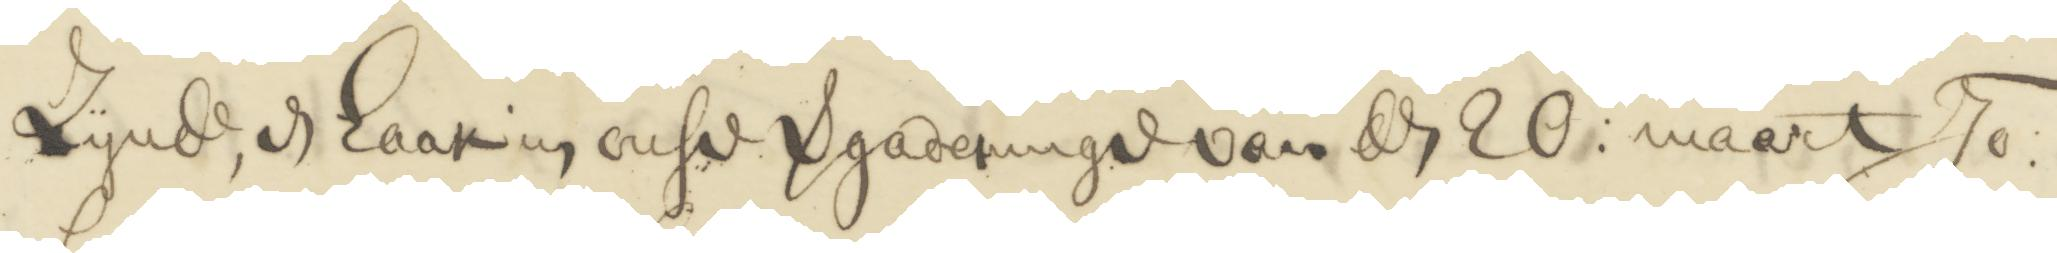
Zijnde, en haar in onse vergaderinge van den 20': maart Jo:
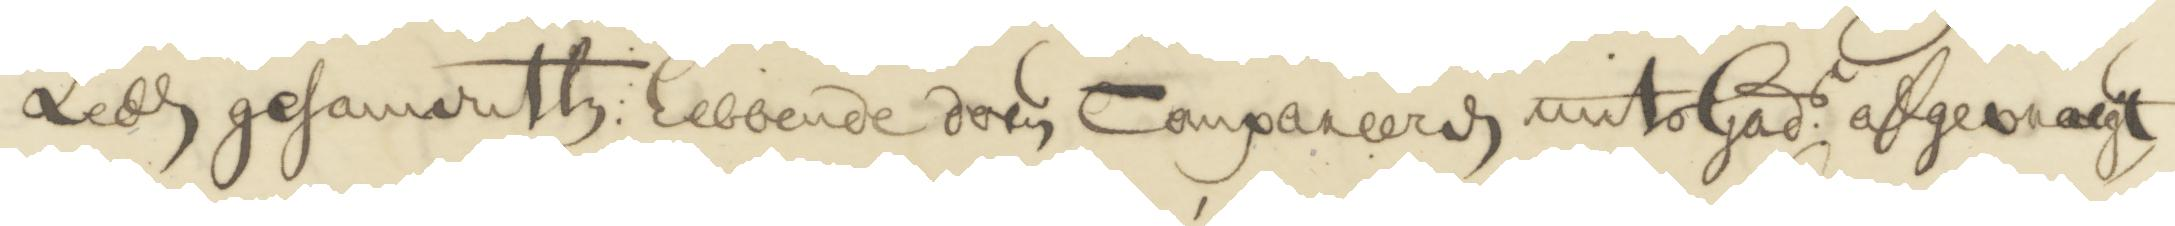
Leden gesamentlijk hebbende doen Compareeren mitsgad:s afgevraegt
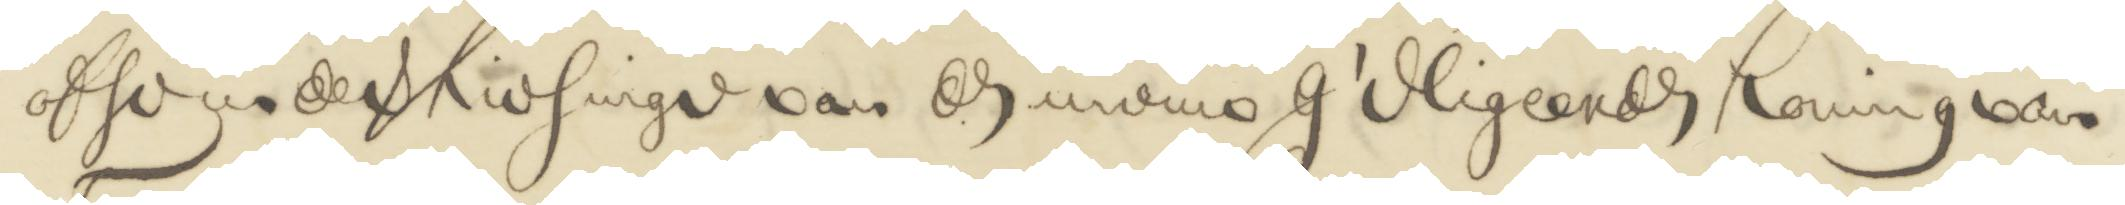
ofse in de verkiesinge van den nieuw g’Eligeerden Koning van
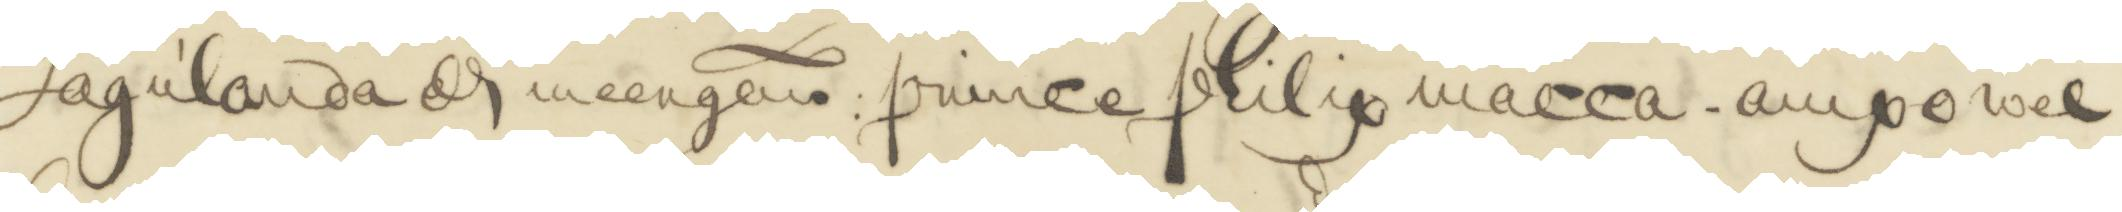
Tagulanda den meer gem: prince philip macca-ampo wel
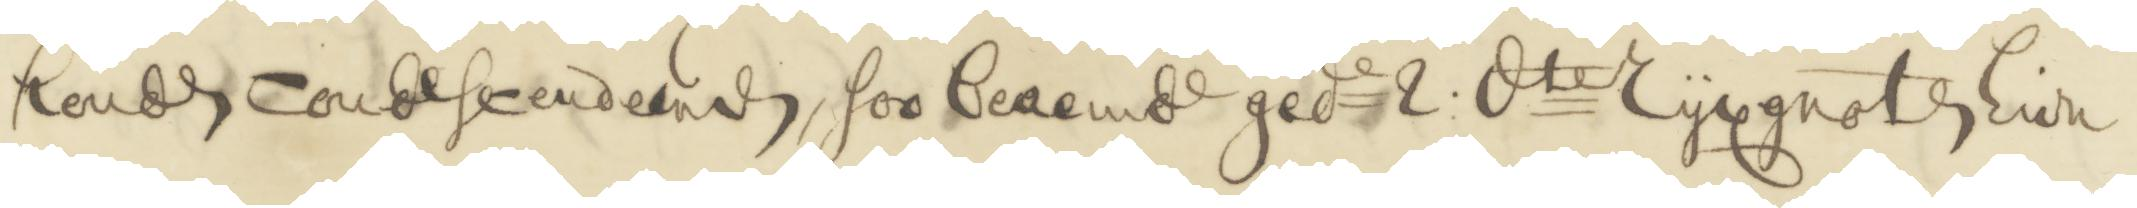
konden condescerdeeren, soo beaemde ged=e 2: d=te rijxgroten hier
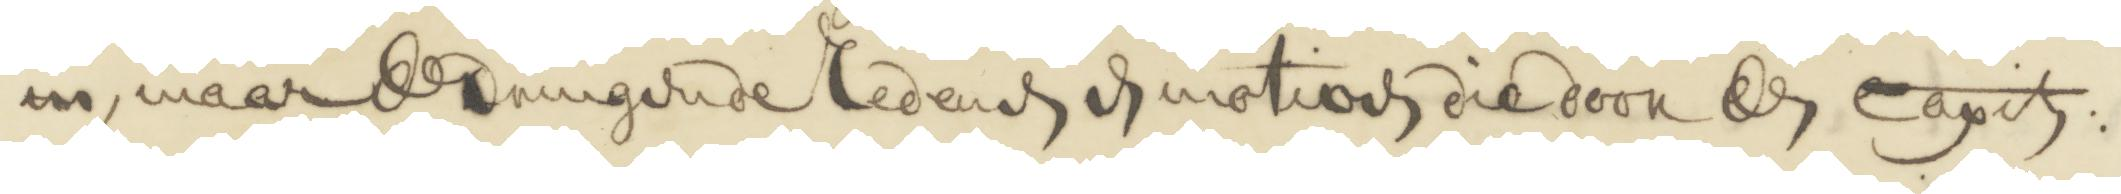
in, maar de dringende Redenen en motiven die door den Capit:
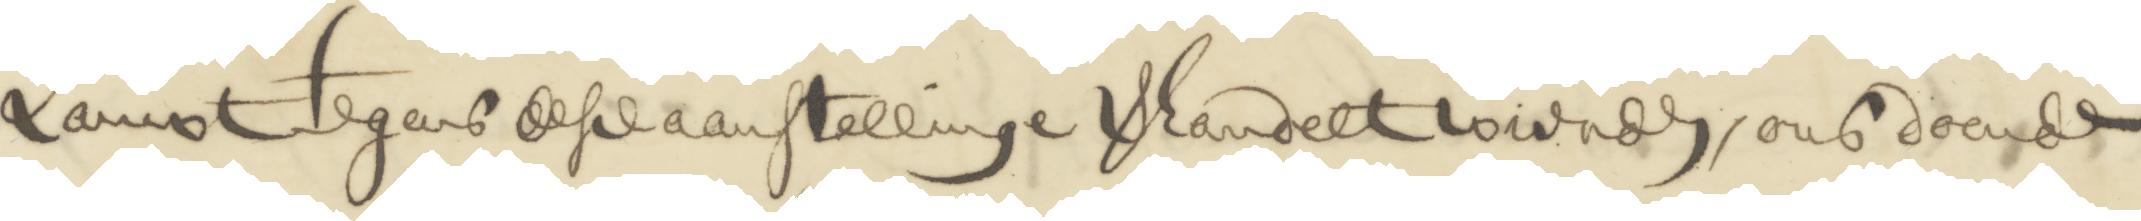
Lauwt tegens dese aanstellinge verhandelt wierden, ons doende
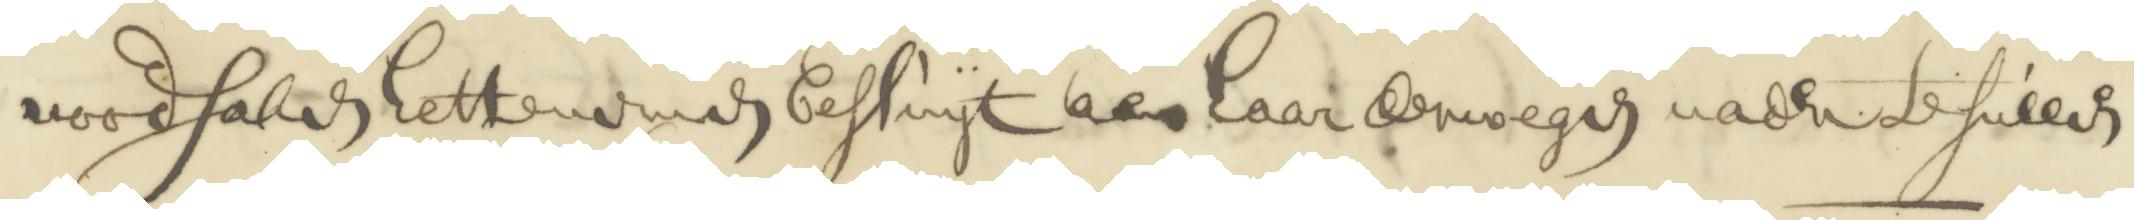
noodsaken het te nemen besluijt aen haar derwegen nader te sullen
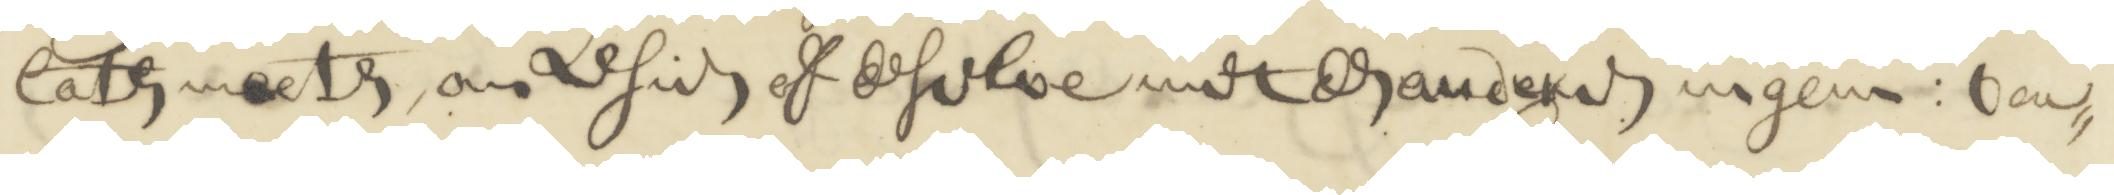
laten weten, om tesien of deselve met den anderen in gem: ver„
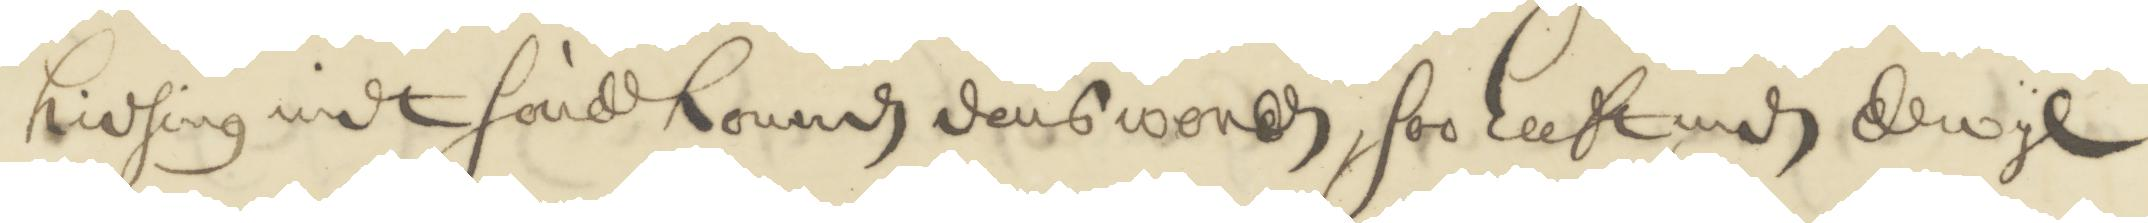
kiesing niet soude konnen eens worden, Soo heeft men dewijl
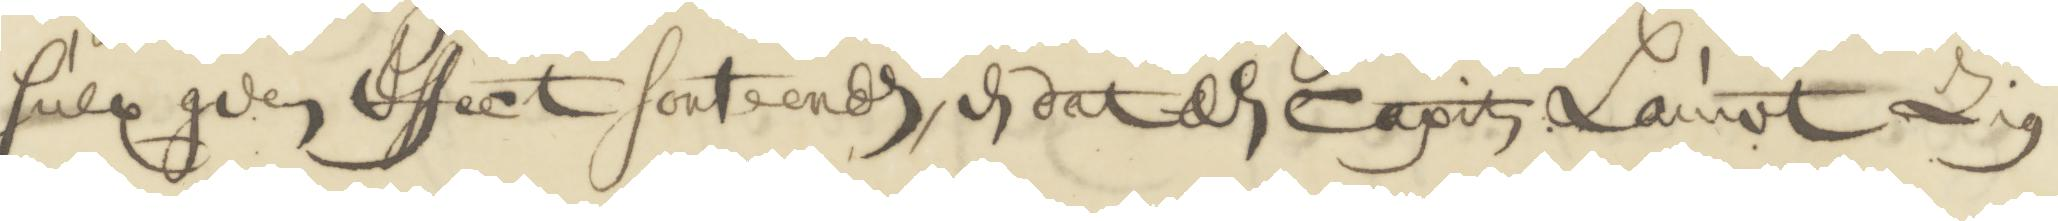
sulx geen Effect sorteerden, en dat den Capit Lauwt Zig
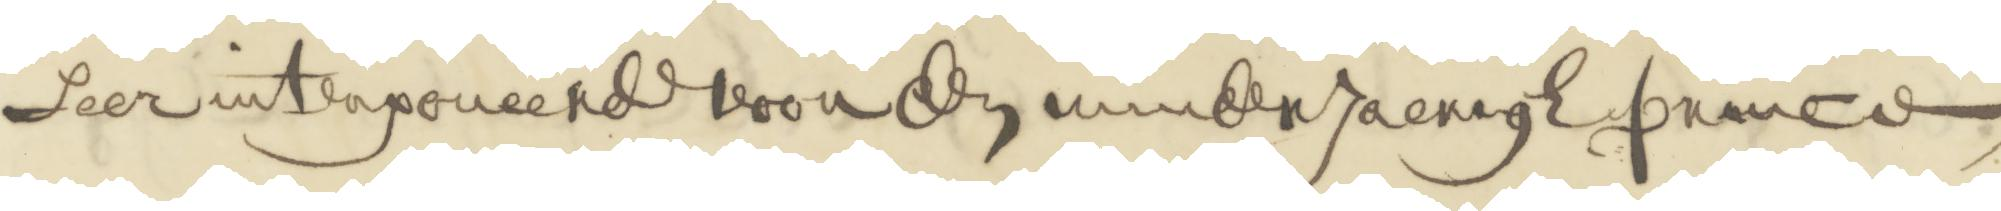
Seer interponeerde voor den minder Jaerigh prince
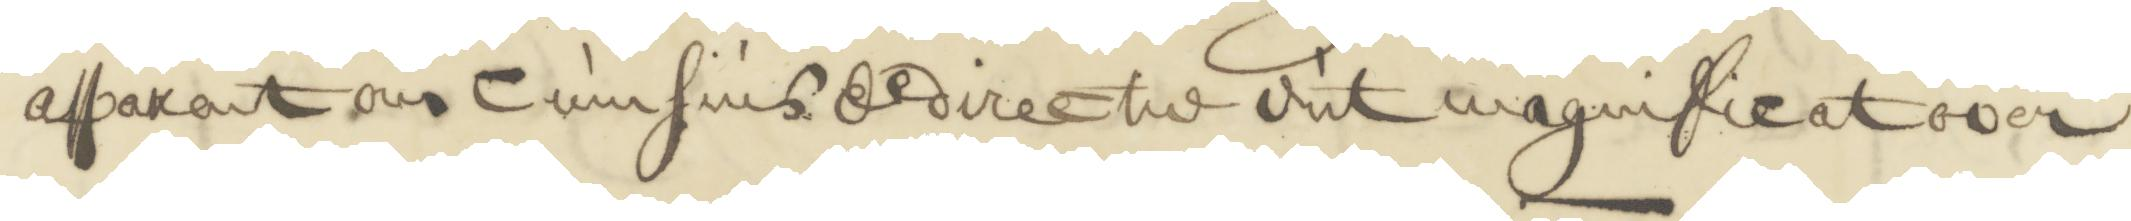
apparant om Cum suis de directie en't magnificat over
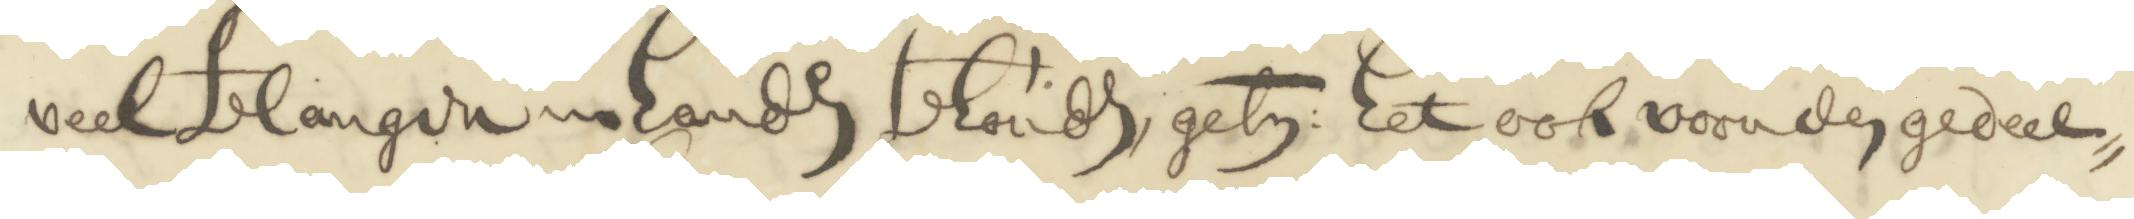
veel te langer in handen te houden, gelijk het ook voor den gedeel„
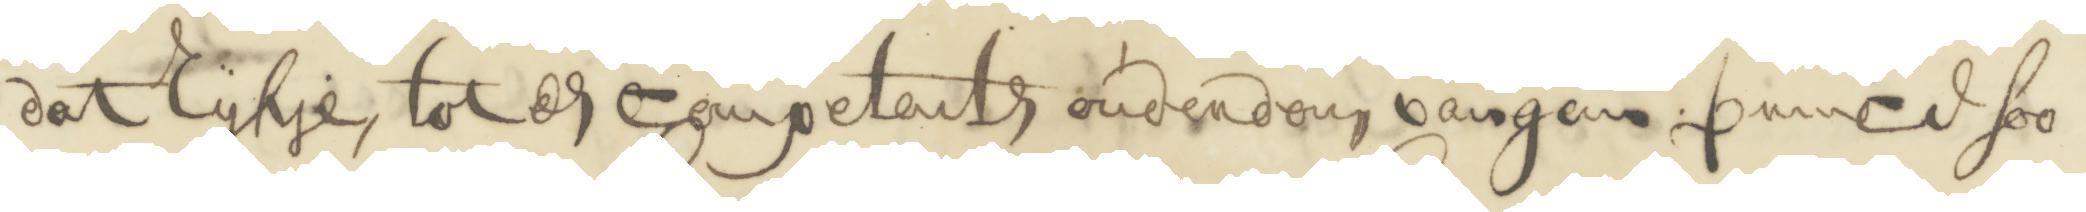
dat Rijkje, tot den Competenten ouderdom van gem: prince Soo
